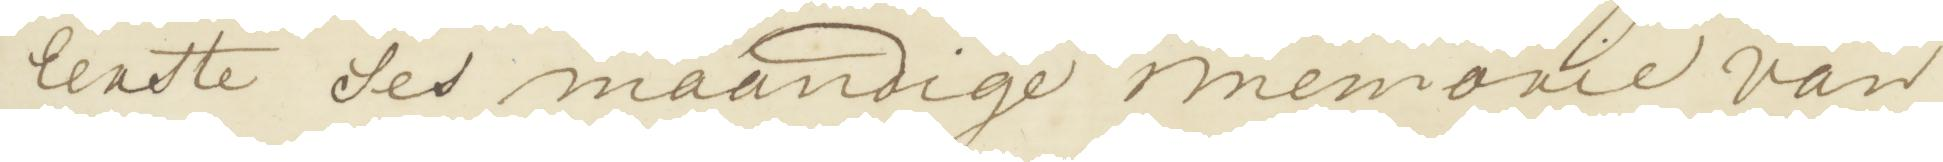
Eerste ses maandige memorie van
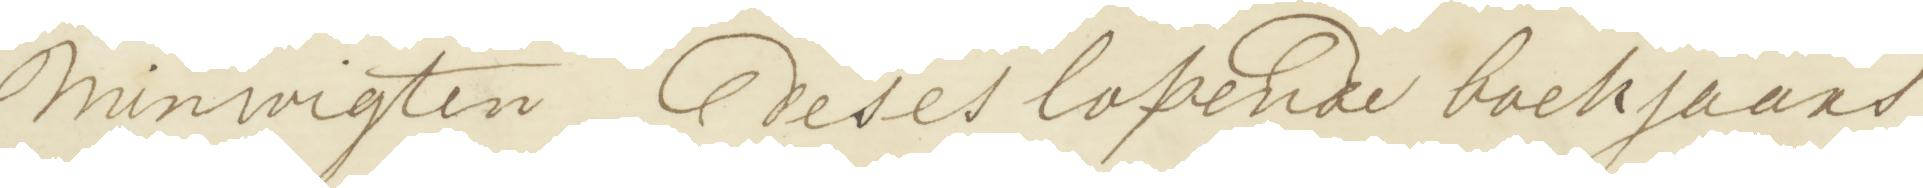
minwigtin deses lopende boekjaars
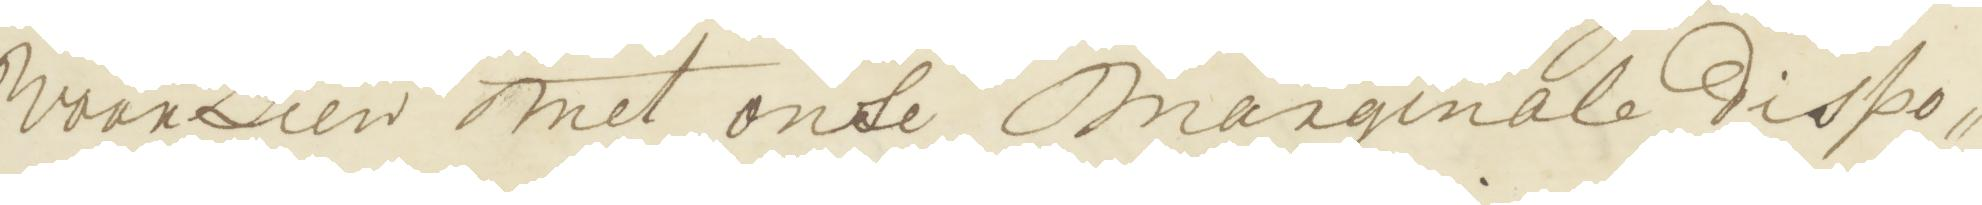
voorzien met onse marginale dispo„
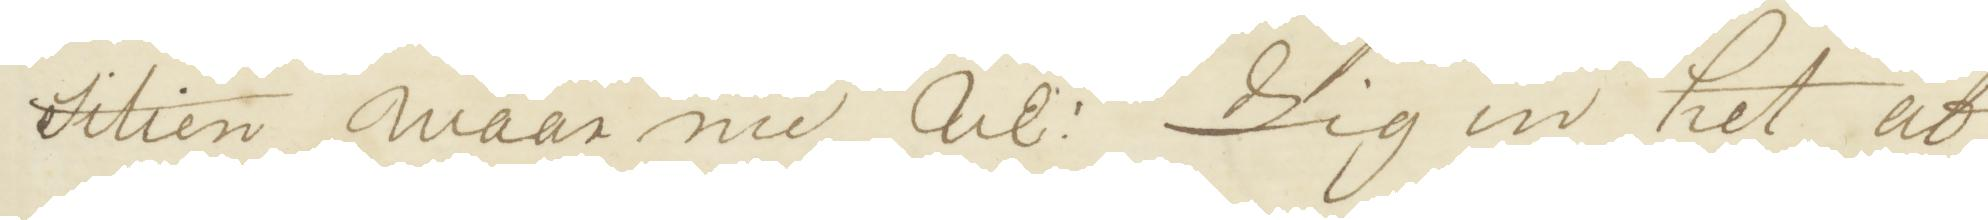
sitien waar nu uE: zig in het af
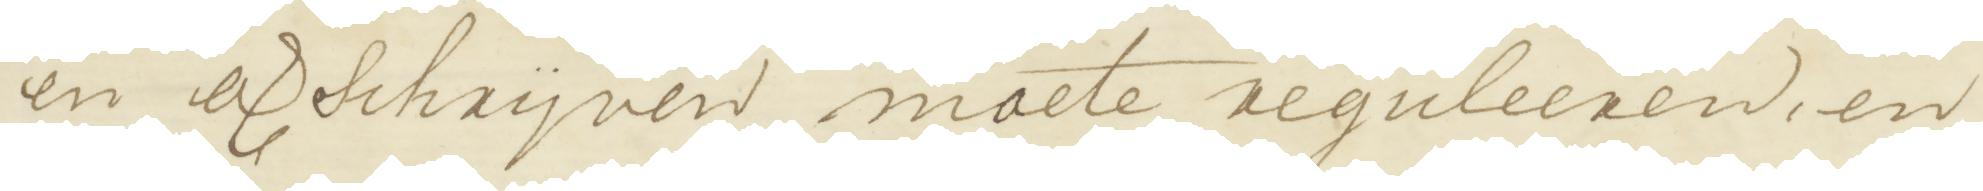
en overschrijven moete reguleeren, en
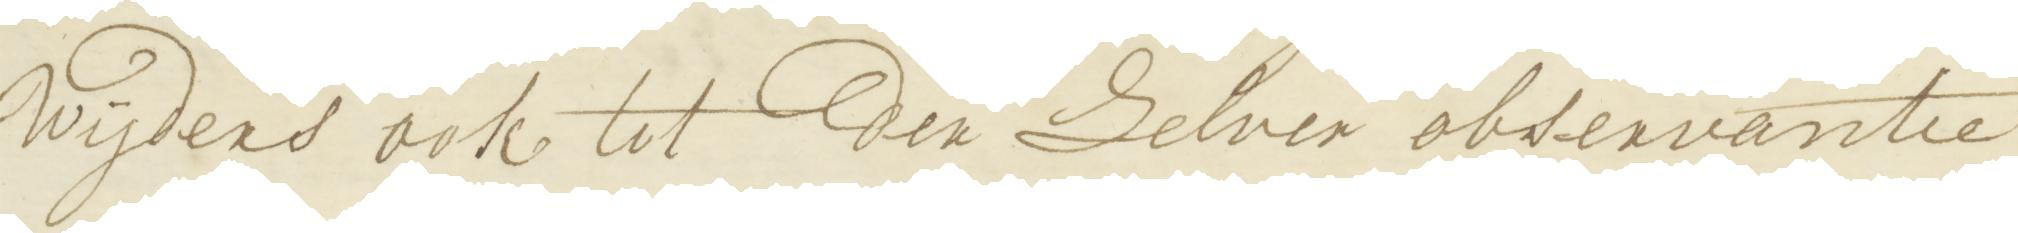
wijders ook tot der zelver observantie
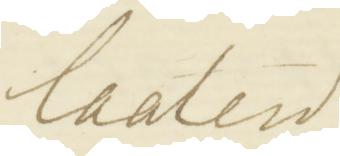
laaten
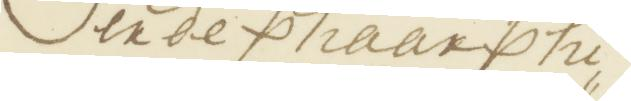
Per de phaarphi„
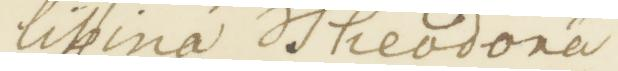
lippina Theodora
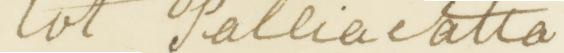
tot Palliacatta
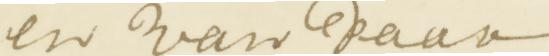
en van daar
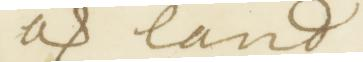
over land
